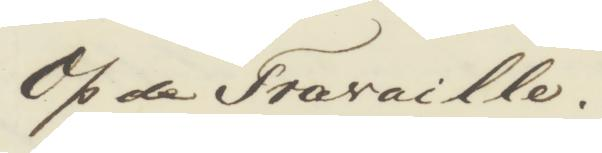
Op de Travaille.
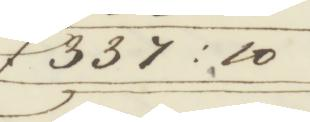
ƒ 337: 10
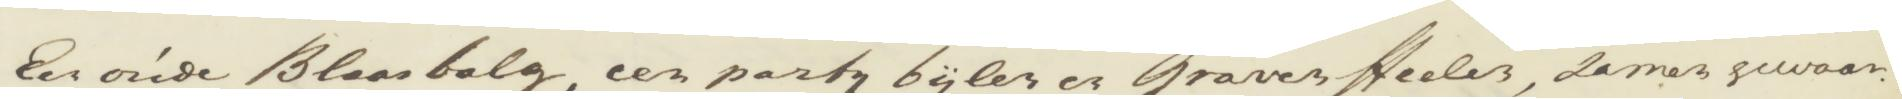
Een oude Blaasbalg, een party bijlen en Graversteelen, zamen gewaar„
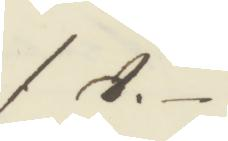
ƒ 8.—
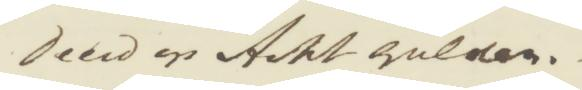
deerd op Acht gulden.
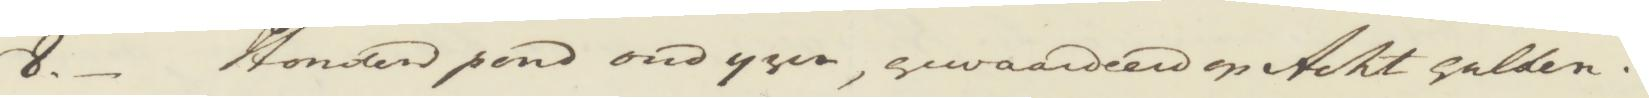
8. — Honderd pond oud yzer, gewaardeerd op Acht gulden.
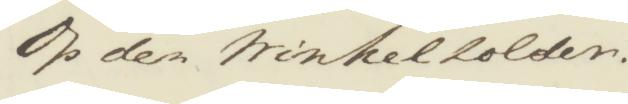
Op den Winkelzolder.
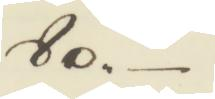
80. —
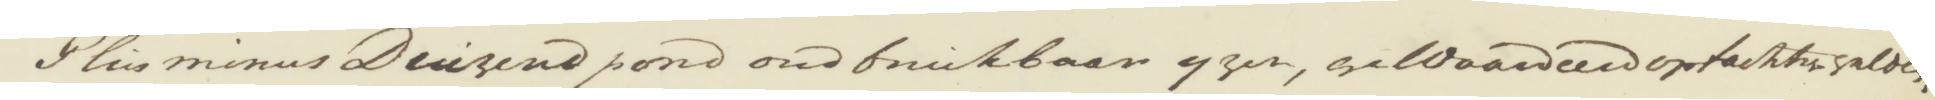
Plusminus Duizend pond oud bruikbaar yzer, gewaardeerd op tachtig gulden,
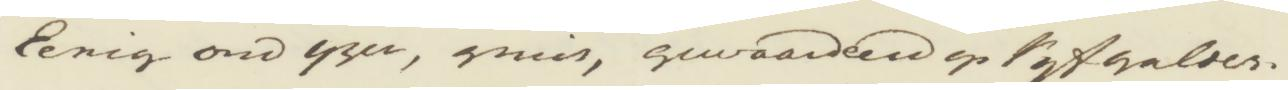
Eenig oud yzer, gruis, gewaardeerd op Vyf gulden
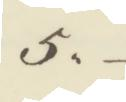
5„ —
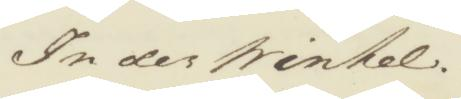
In den Winkel.
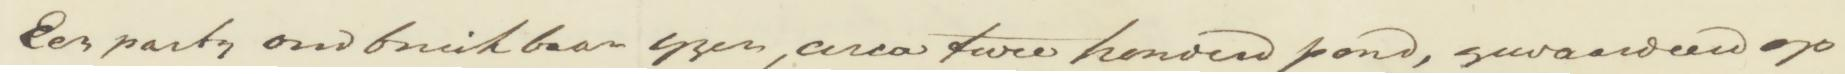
Een party oud bruikbaar yzer, circa twee honderd pond, gewaardeerd op
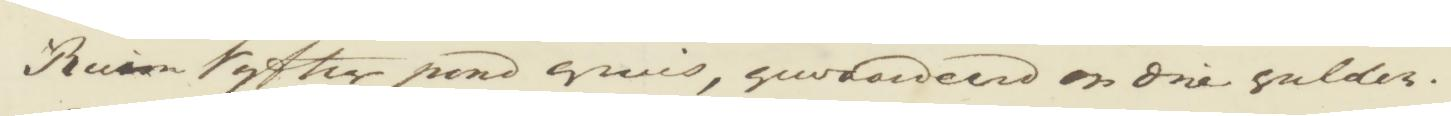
Ruim Vyftig pond gruis, gewaardeerd op drie gulden.
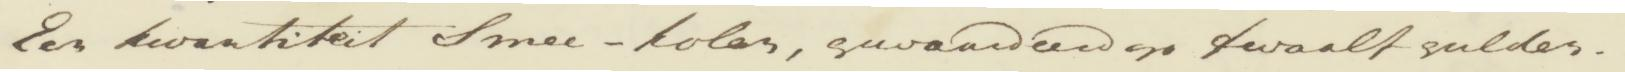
Een kwantiteit Smee-kolen, gewaardeerd op twaalf gulden.
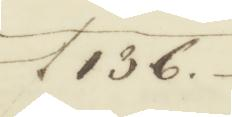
ƒ136.—
